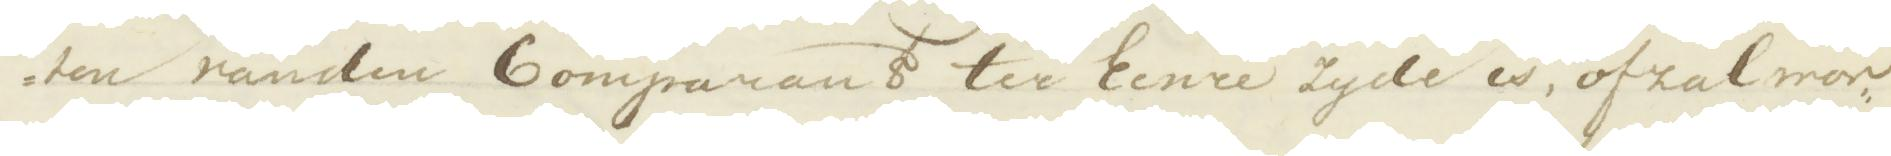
=ten van den Comparant ter Eenre zyde is, of zal wor„
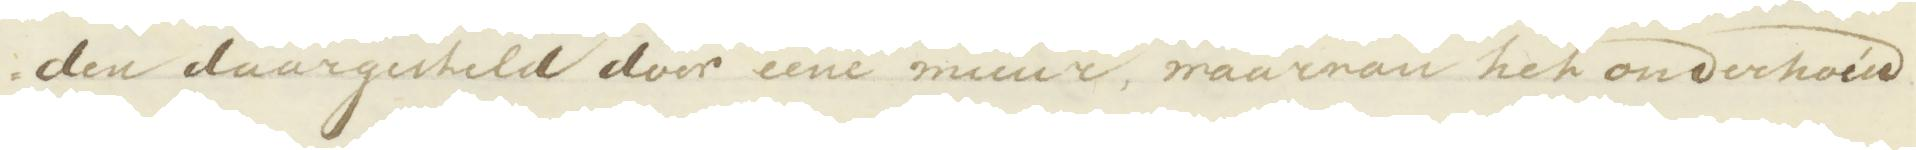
=den daargesteld door eene muur, waarvan het onderhoud
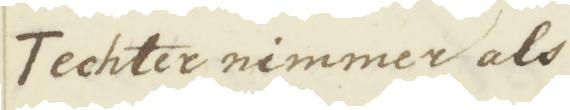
T echter nimmer als
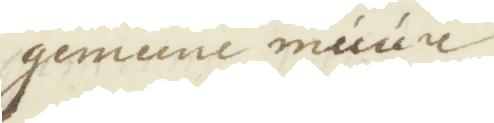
gemeene muur
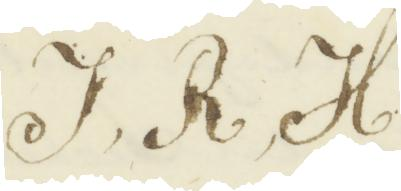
J, R, H
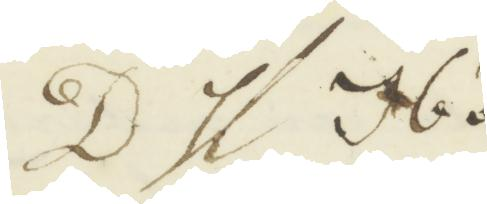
D HHH
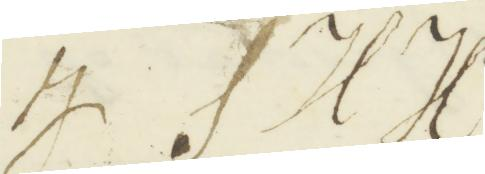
J SHH
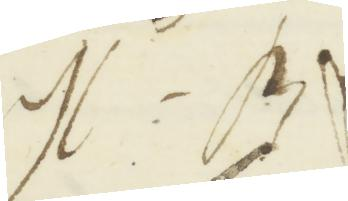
H:B
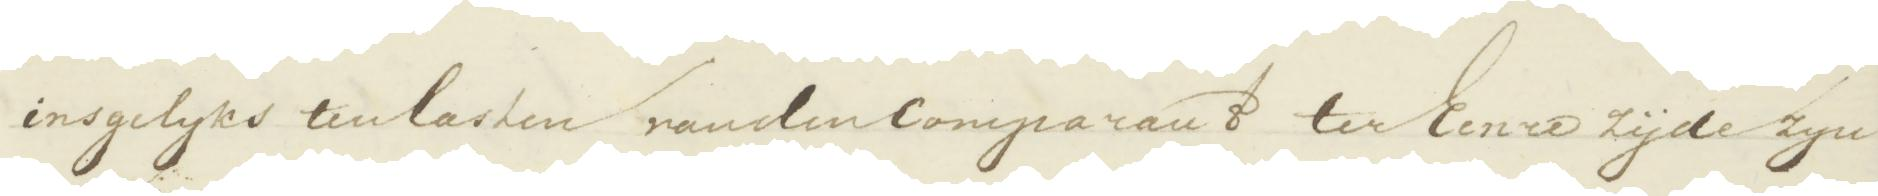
insgelyks ten lasten van den Comparant ter Eenre zijde zyn
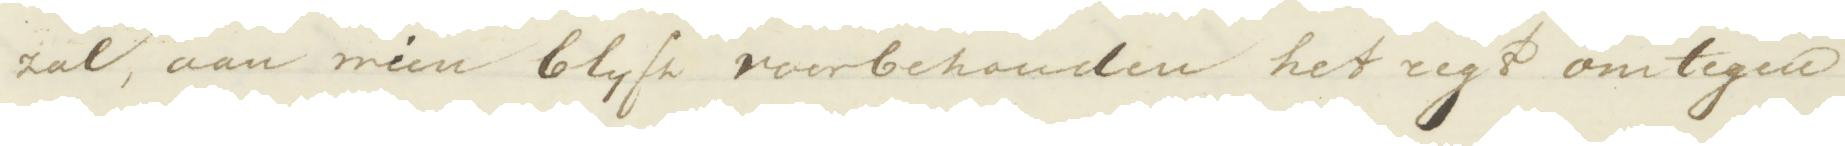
zal, aan wien blijft voorbehouden het regt om tegen
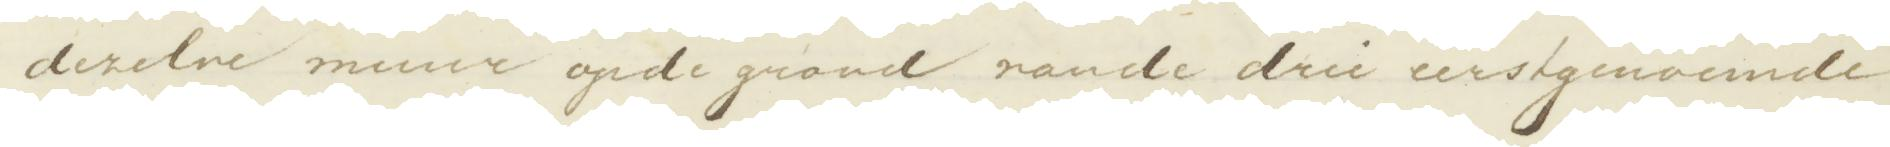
dezelve muur op de grond vande drie eerstgenoemde
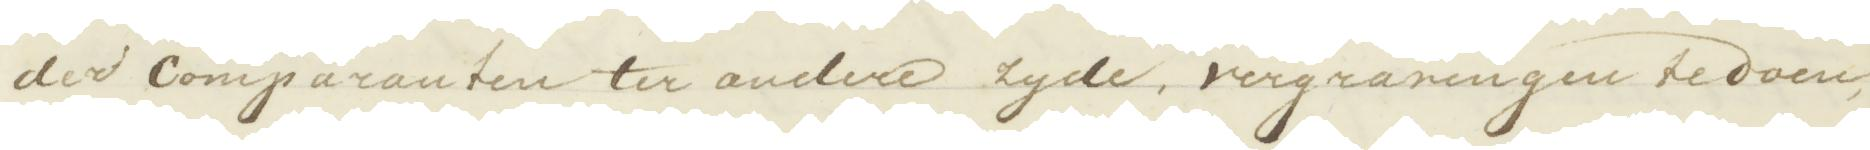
der Comparanten ter andere zijde, vergravingen te doen,
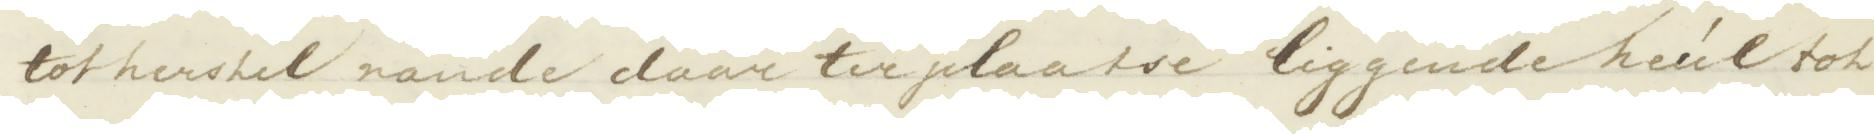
tot herstel vande daar ter plaatse liggende heul tot
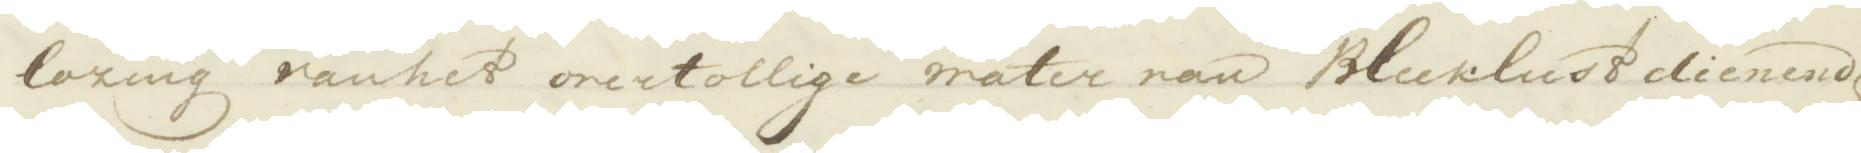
lozing van het overtollige water van Bleeklust dienende
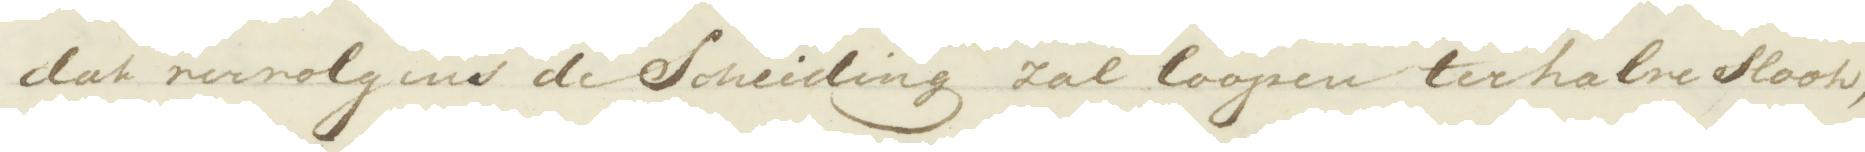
dat vervolgens de Scheiding zal loopen ter halve sloot,
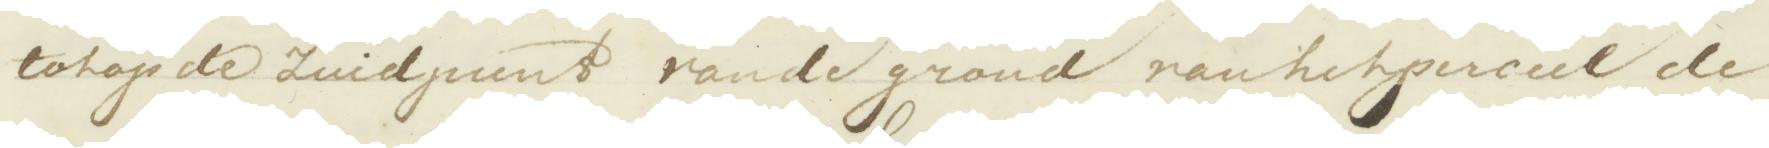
tot op de zuidpunt van de grond van het perceel de
